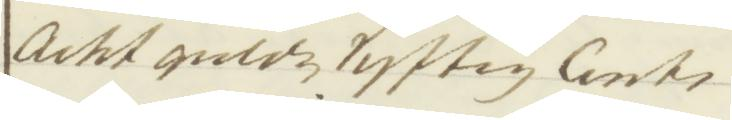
Acht gulden Vyftig Cents
